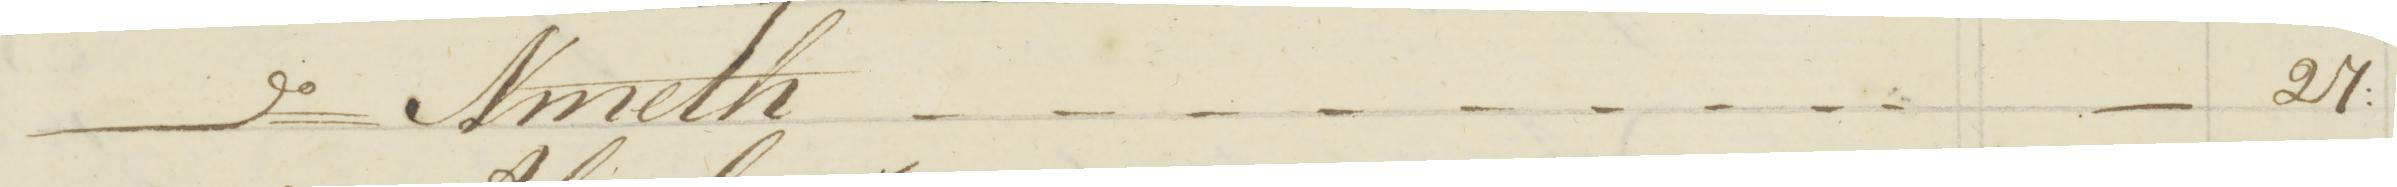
—:o Nmeth — 27:
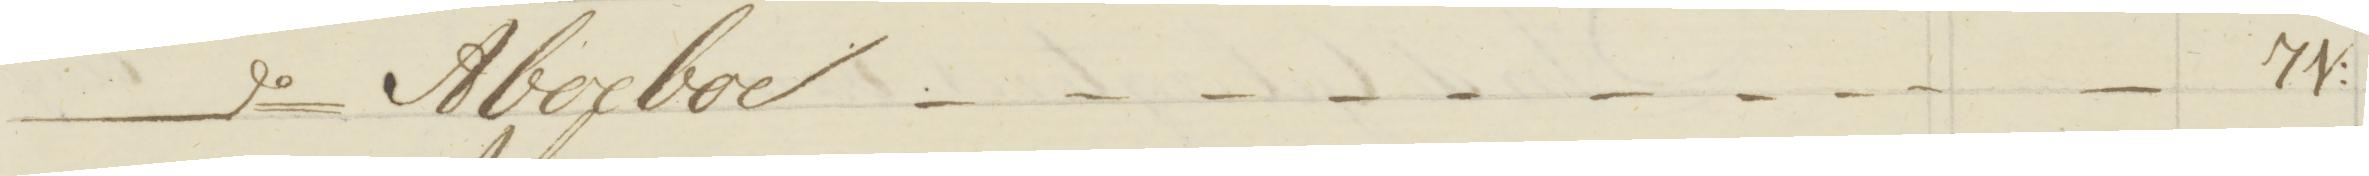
—:o Aboeboe — 71:
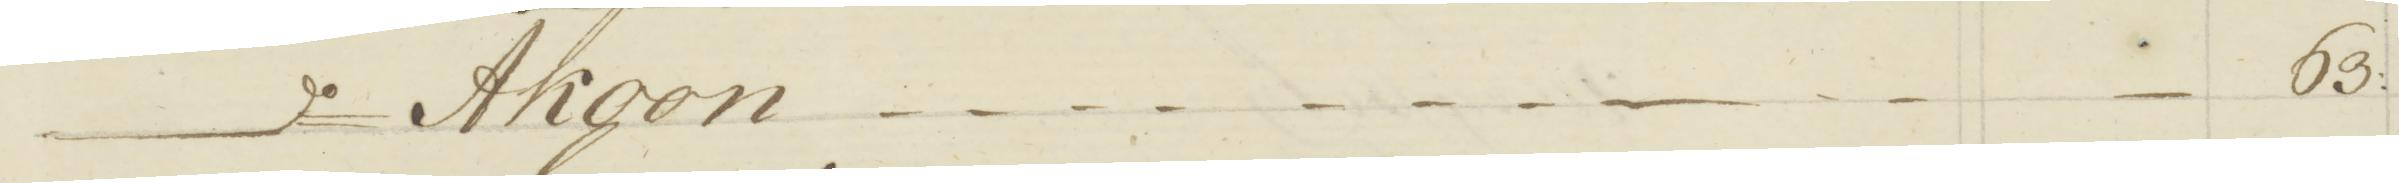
—:o Akoon — 63:
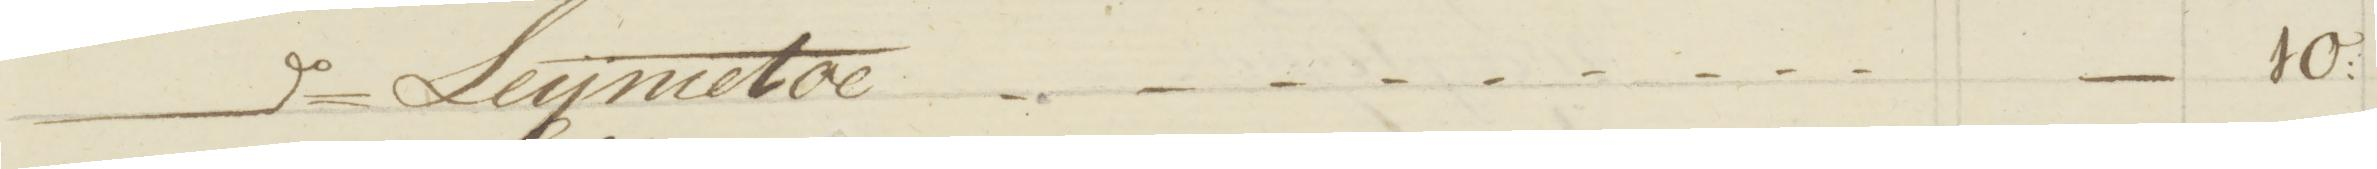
—:o Leijnietoe — 10:
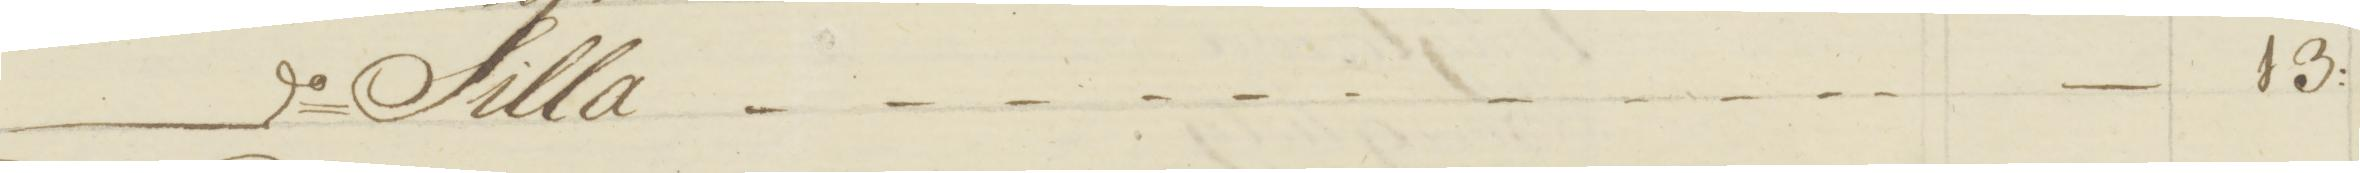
—:o Silla — 13:
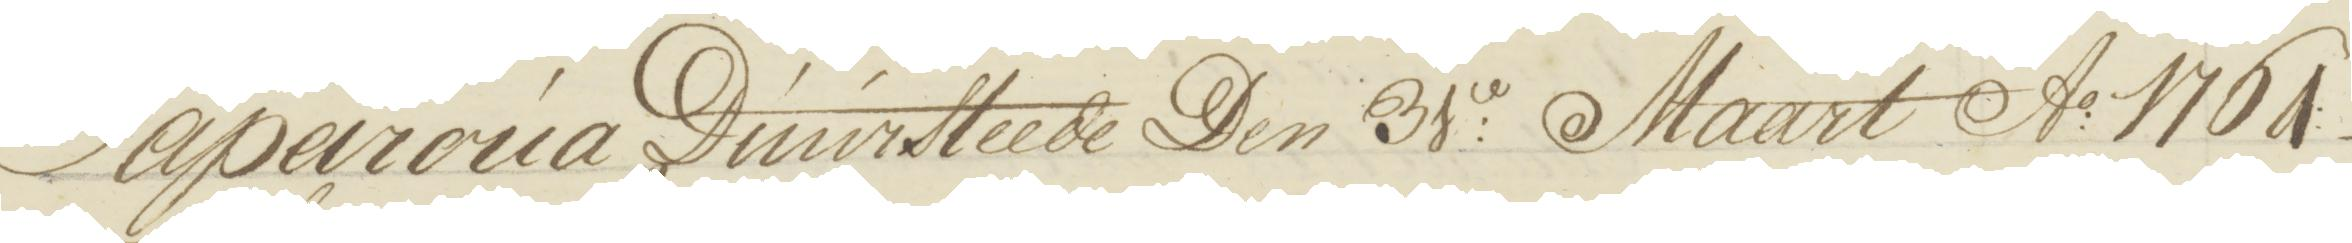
Saparoua Duursteede Den 31:e Maart A:o 1764: —
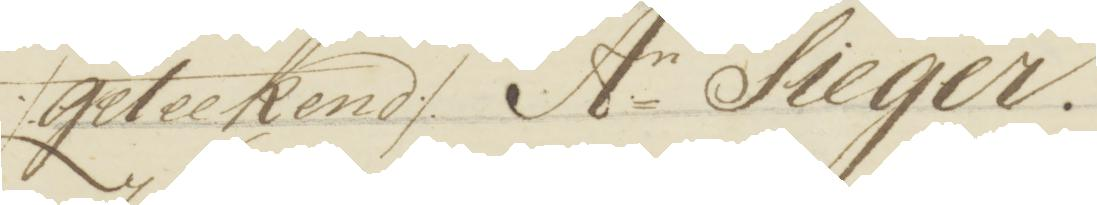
/geteekend/ A=n Sieger.
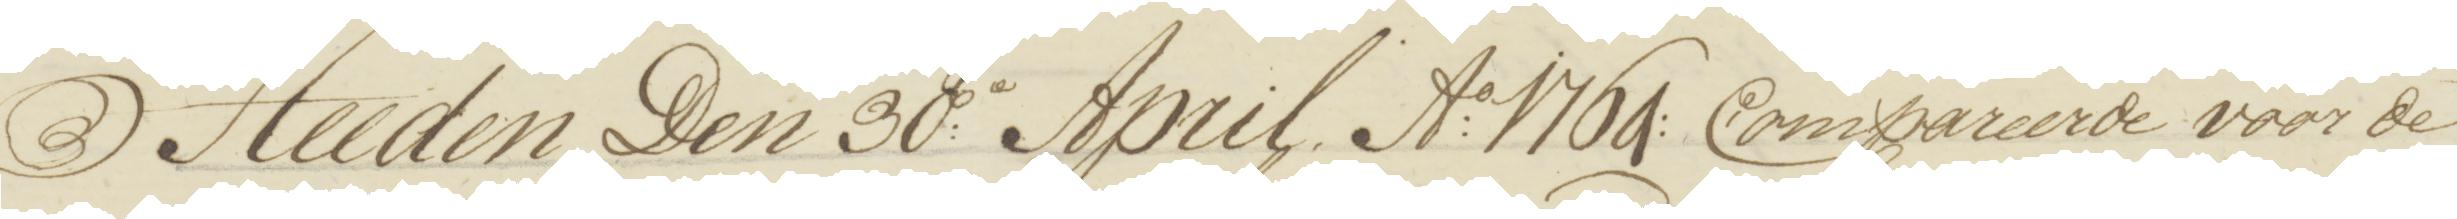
Heeden Den 30:e April A:o 1764: Compareerde voor de
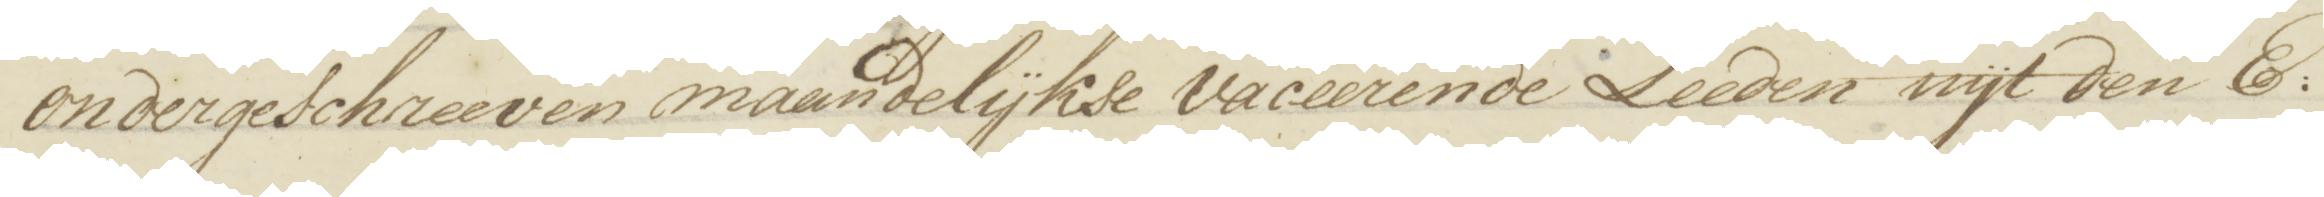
ondergeschreeven maandelijkse vaceerende Leeden uijt den E:
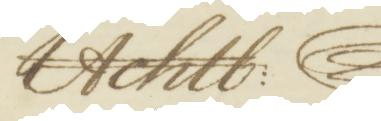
Achtb:
